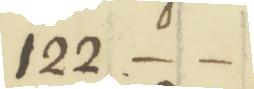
122 - -
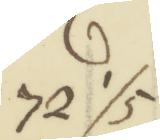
72 1/5
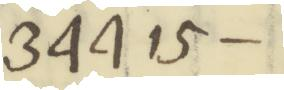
344 15 -
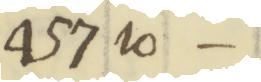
457 10 -
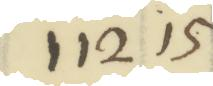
112 15 -
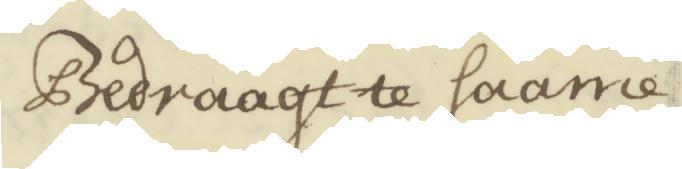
Bedraagt te saame
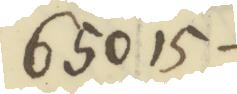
650 15
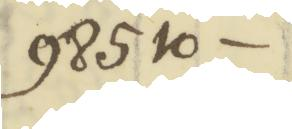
985 10 -
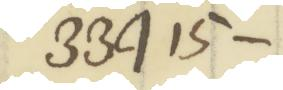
334 15 -
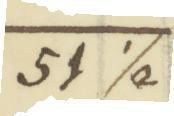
51½
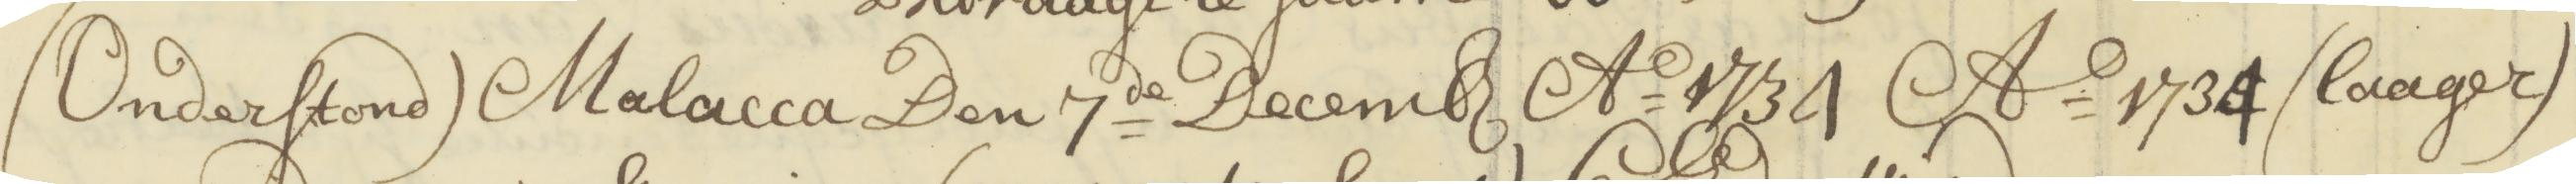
(Onderstond) Malacca Den 7=de Decemb A=o 1734 A=o 1734 (laager)
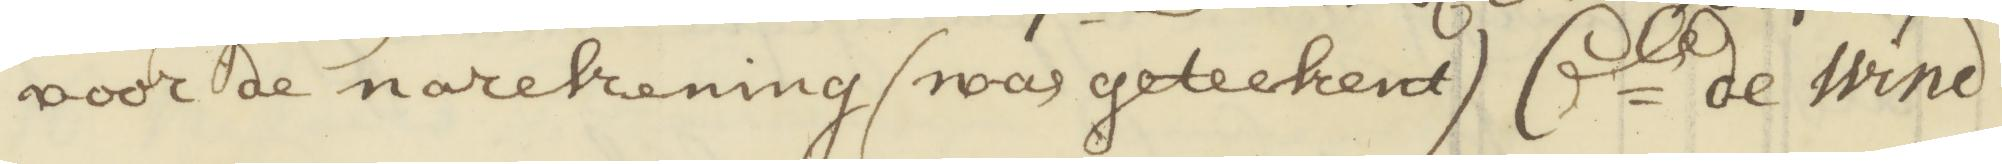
voor de narekening (was geteekent) C=le de wind
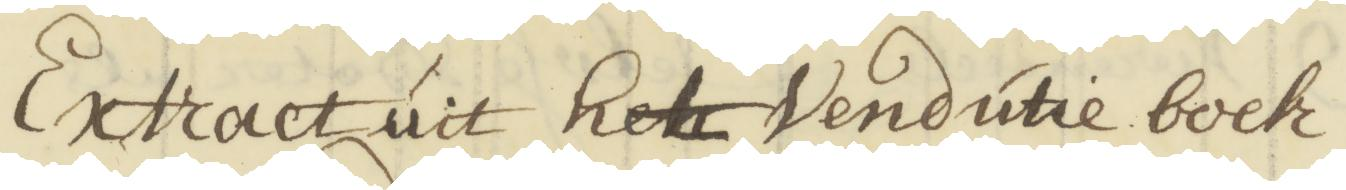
Extract uit het Vendutie boek
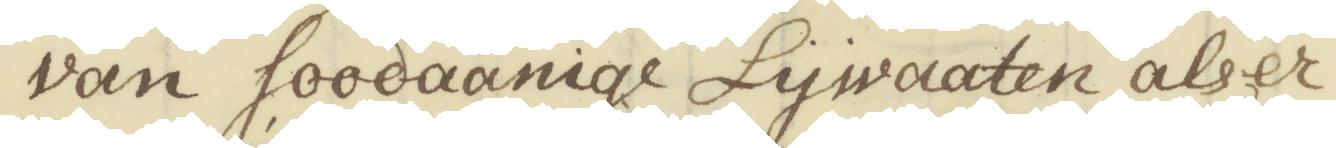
van soodaanige lijwaaten als er
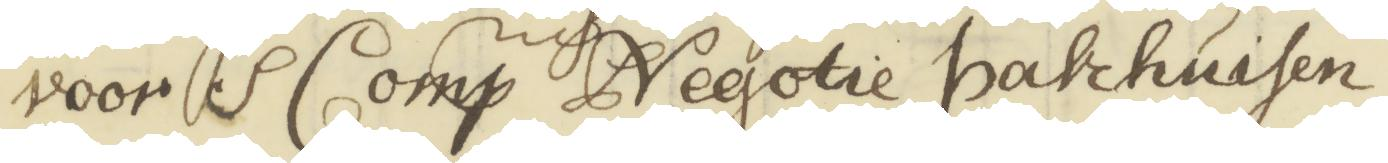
voor 's Compne Negotie pakhuisen
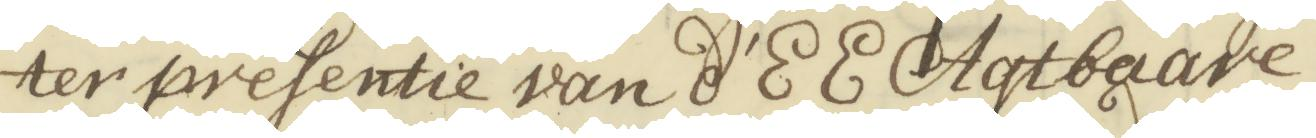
ter presentie van d’ E E Agtbaare
